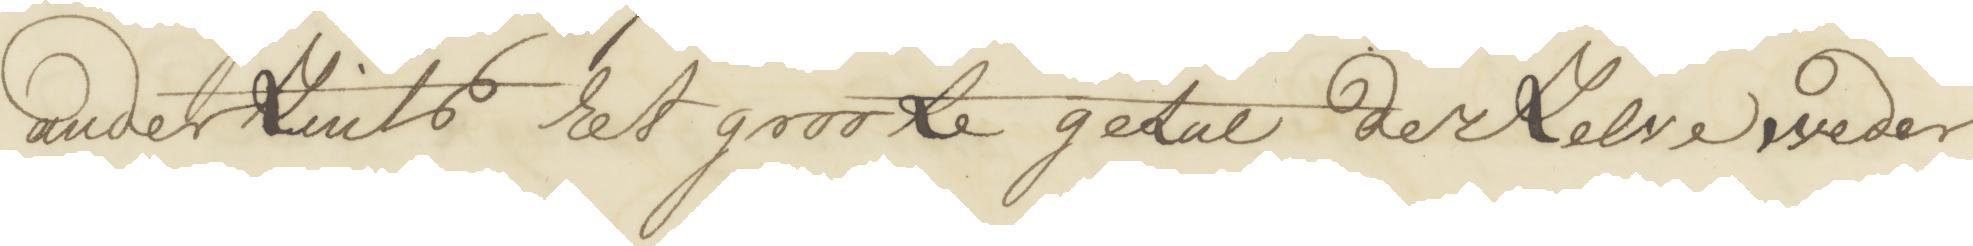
anderzints het groote getal derzelve weder
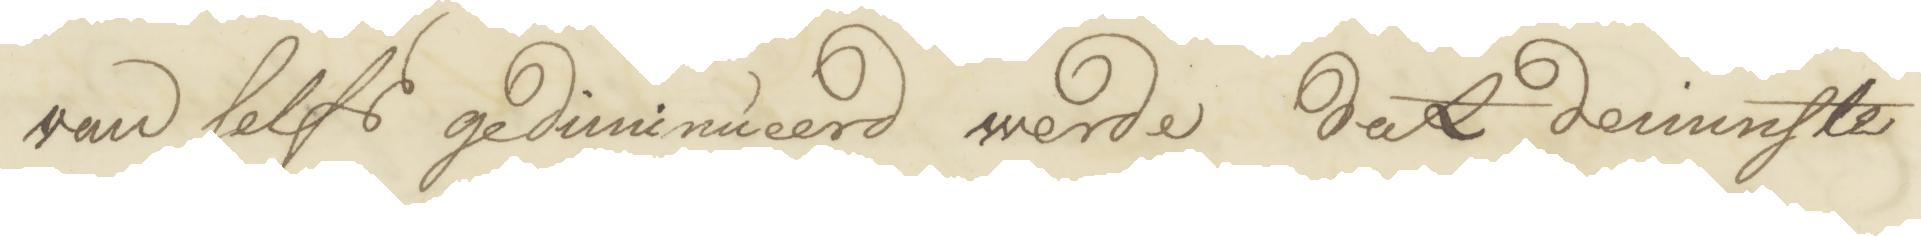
van selfs gediminueerd werde dat deminste
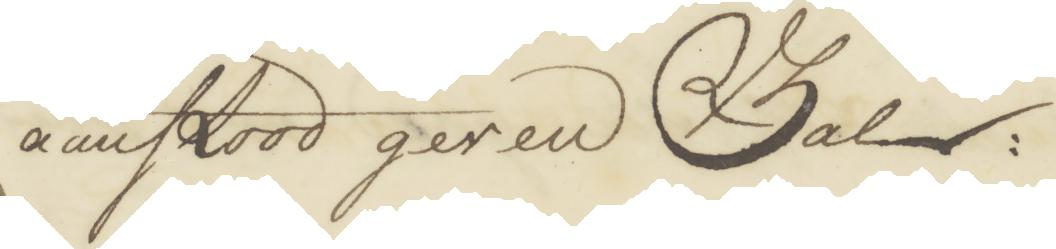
aanstood geven Zal:
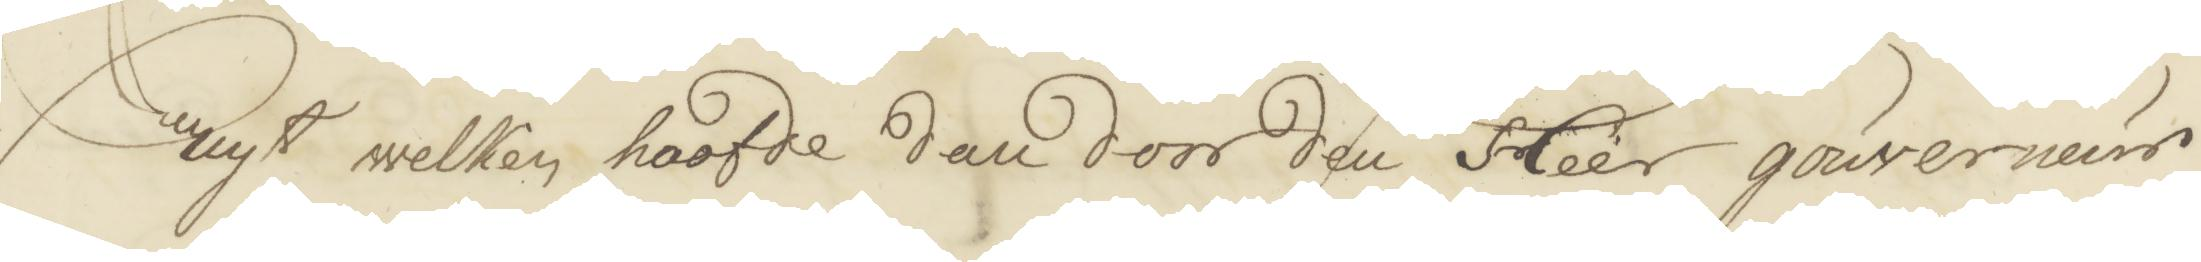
Uyt welken hoofde dan door den Heer gouverneur
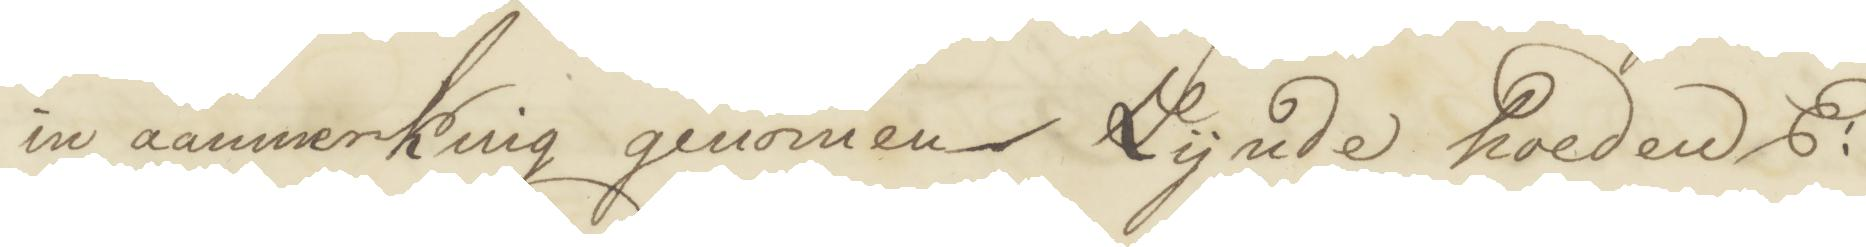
in aanmerking genomen zijnde hoeden E:
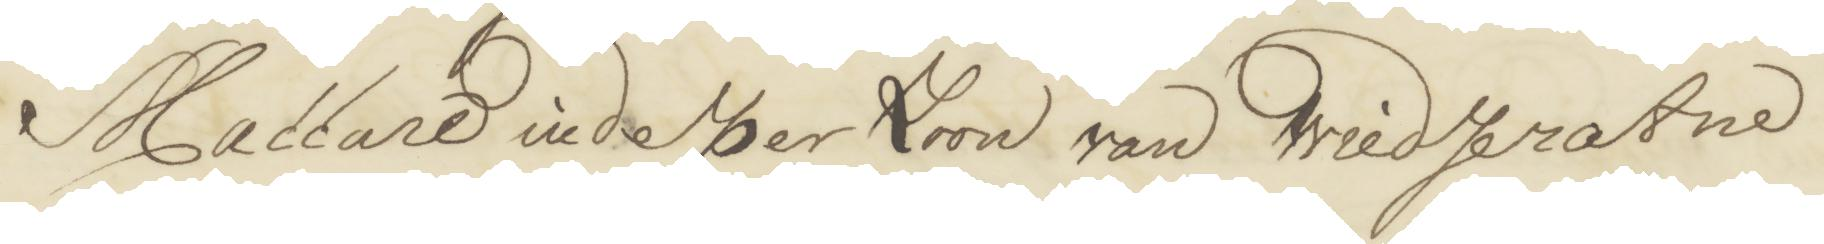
Maccare in de perzoon van wiedjeratne
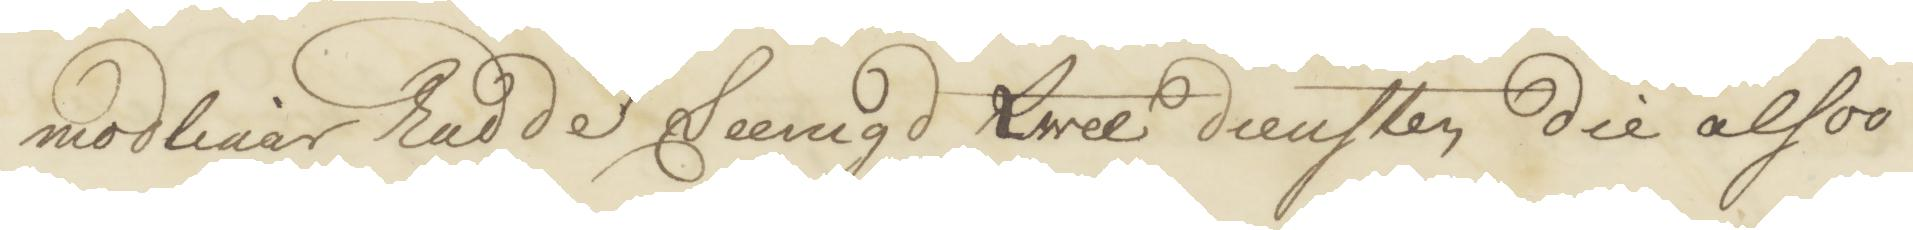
modliaar hadde vereenigd twee diensten die alsoo
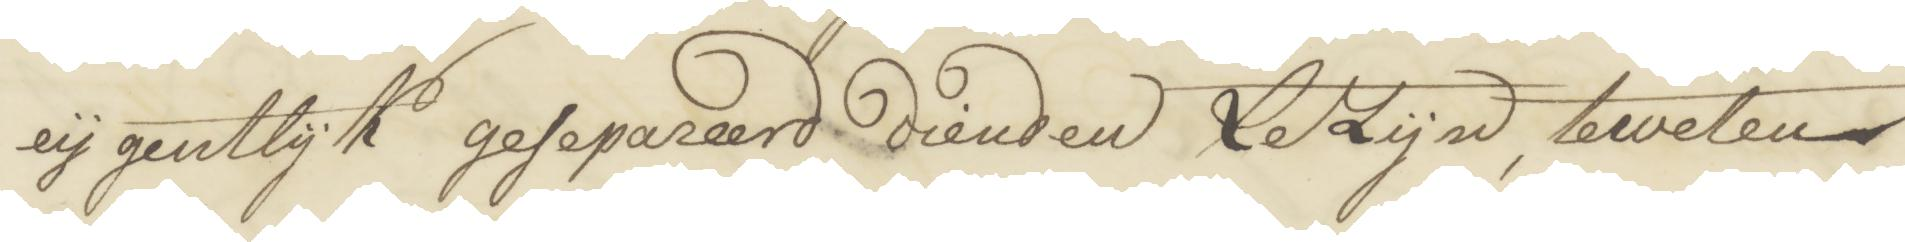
eijgentlijk gesepareerd dienden tezijn, teweten
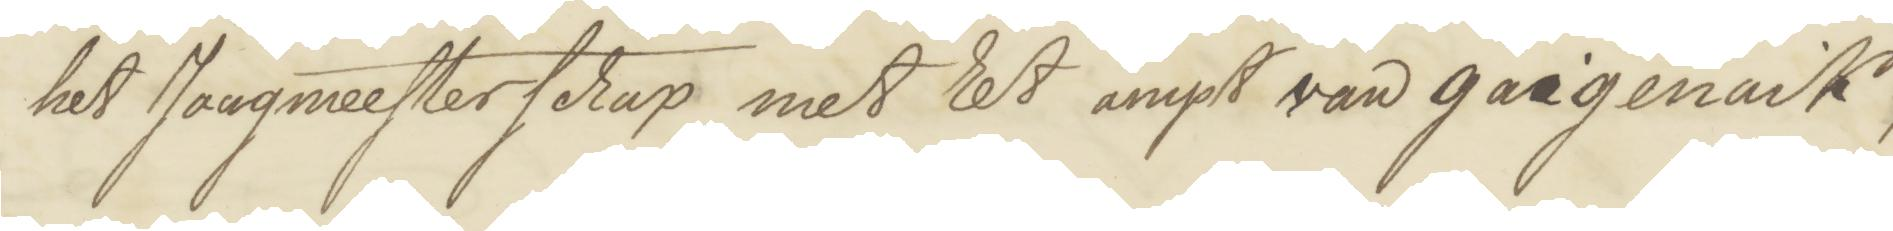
het Jongmeesterschap met het ampt van gaigenaik,
